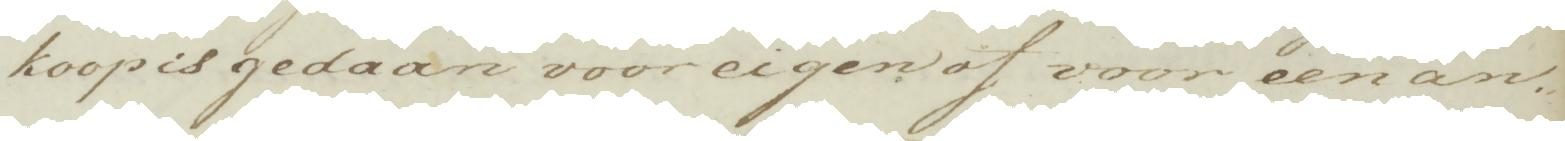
koop is gedaan voor eigen of voor een an„
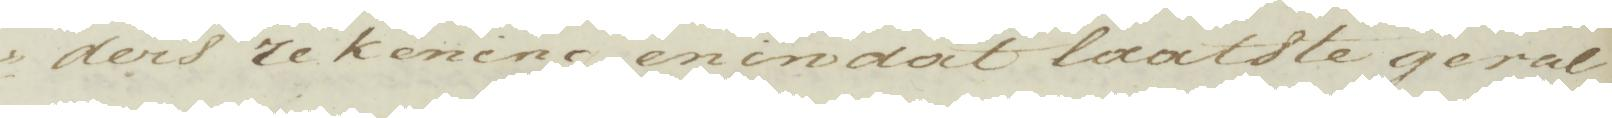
„ ders rekening, en in dat laatste geval
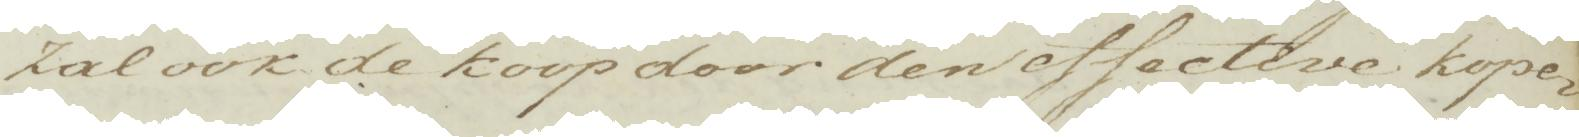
zal ook de koop door den effective koper
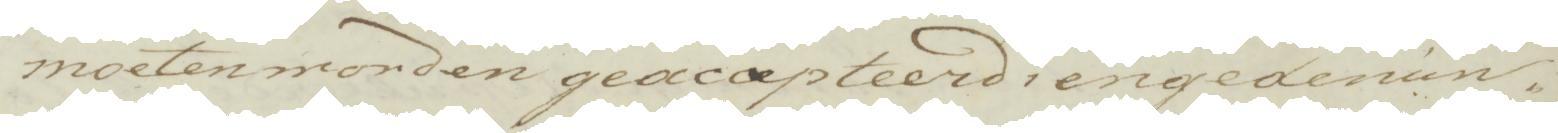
moeten worden geaccepteerd, en gedenun„
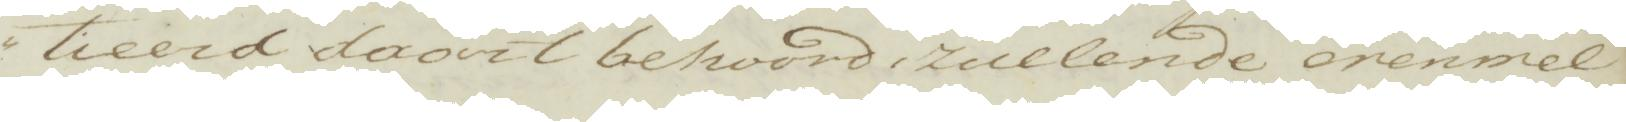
tieerd daart behoord, zullende evenwel
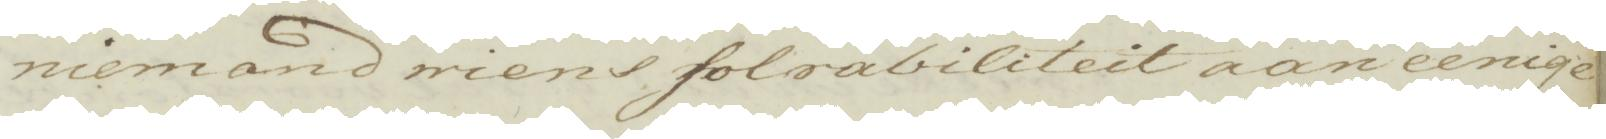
niemand wiens solvabiliteit aan eenige
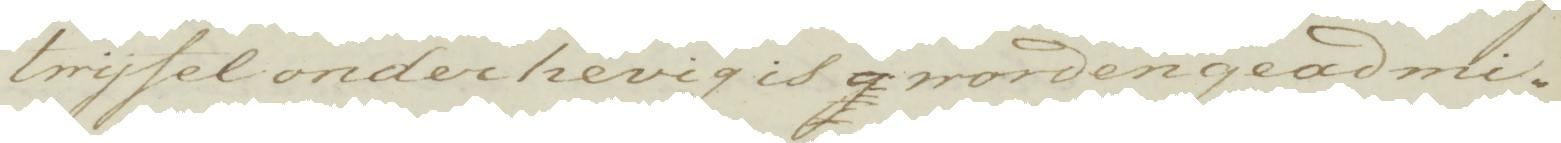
twijfel onderhevig is g worden geadmi„
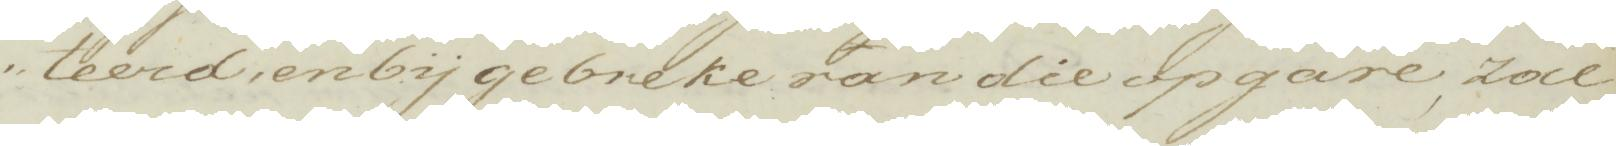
„teerd, en bij gebreke van die opgave, zal
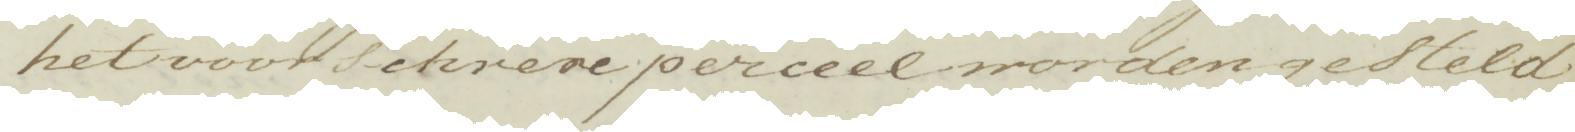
het voor schreve perceel worden gesteld,
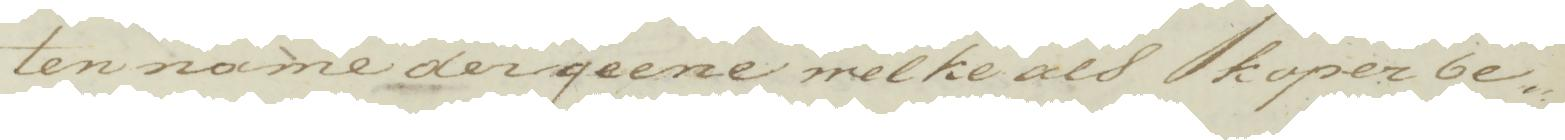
ten name der geene welke als koper be„
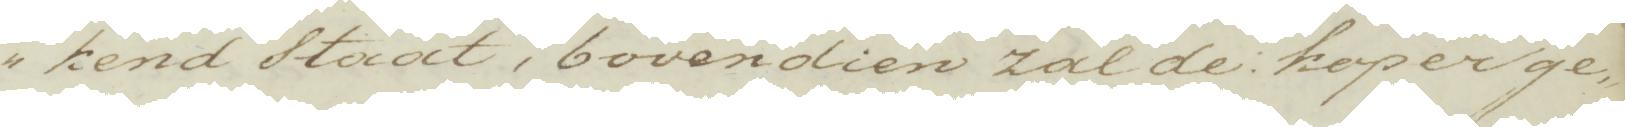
„kend staat, bovendien zal de: koper ge„
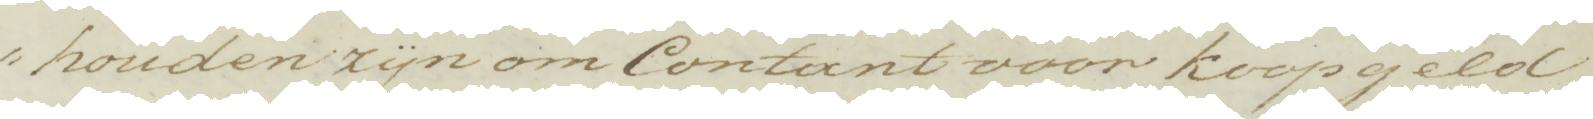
„houden zijn om Contant voor koopgeld
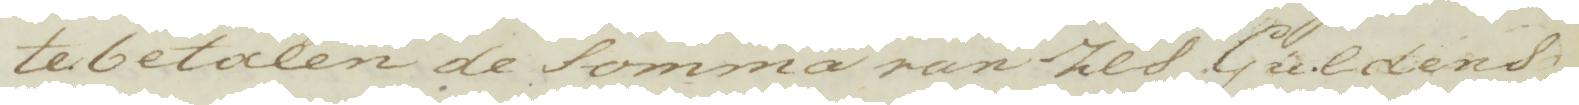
te betalen de somma van Zes Guldens,
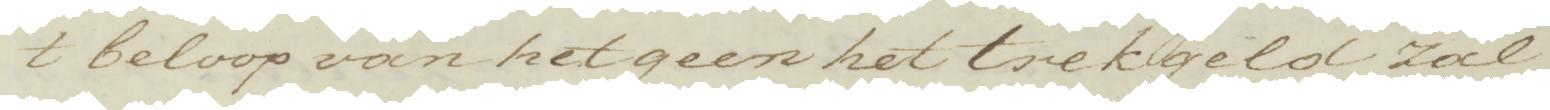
’t beloop van hetgeen het trekgeld zal
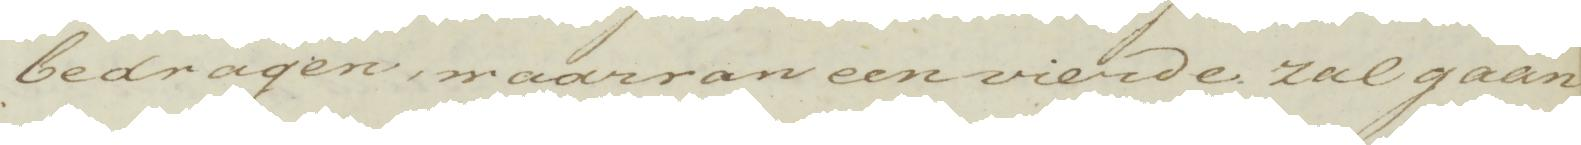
bedragen, waarvan een vierde zal gaan
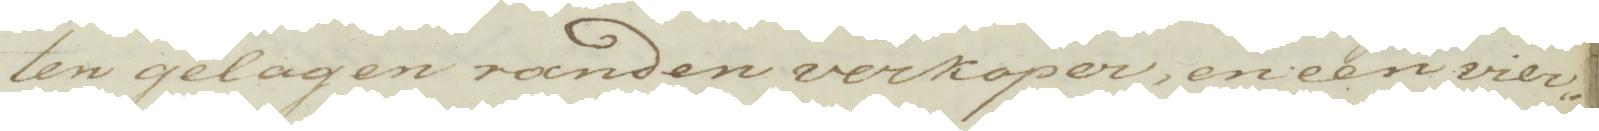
ten gelagen vanden verkoper, en een vier„
